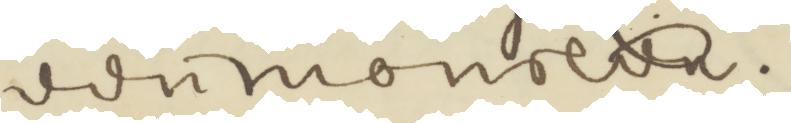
een monster.
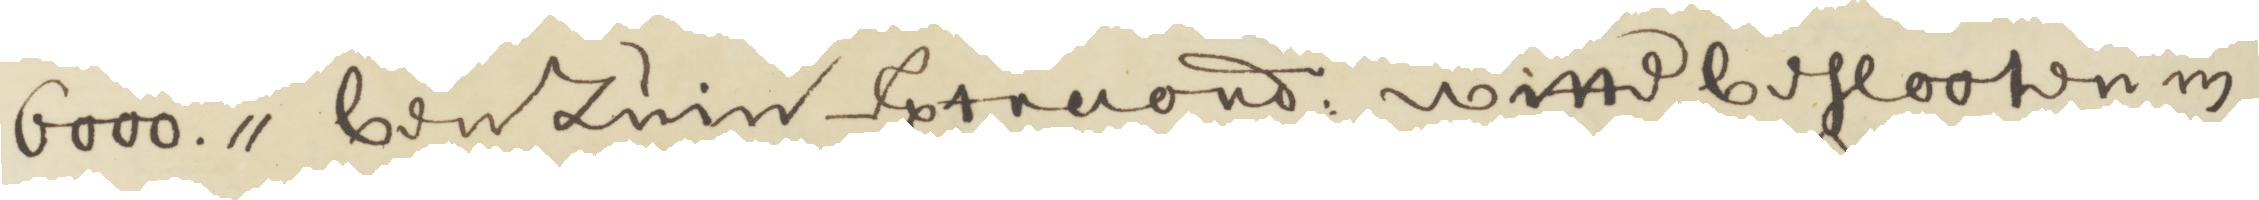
6000. „ benzuin Extraord: witte beslooten in
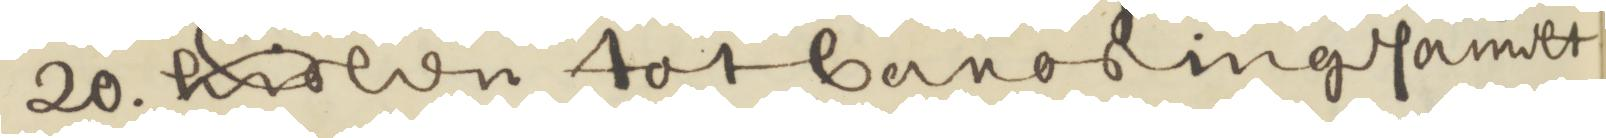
20. kisten tot baros ingesamelt
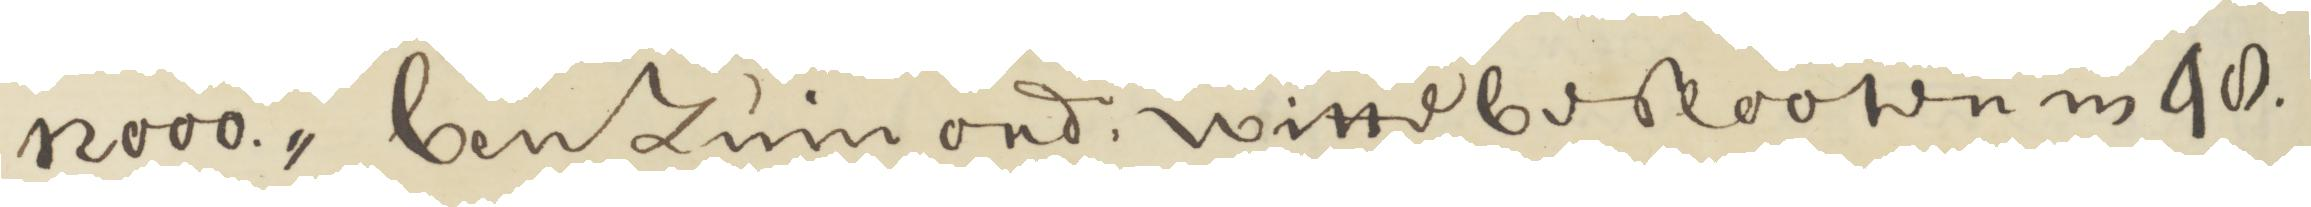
12000. „ benzuin ord: witte beslooten in 48.
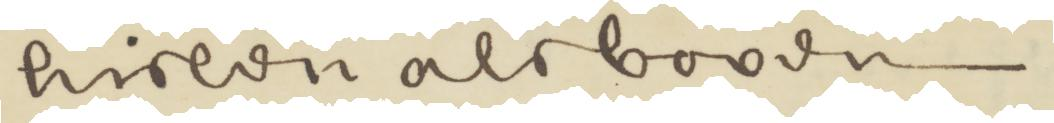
kisten als boven
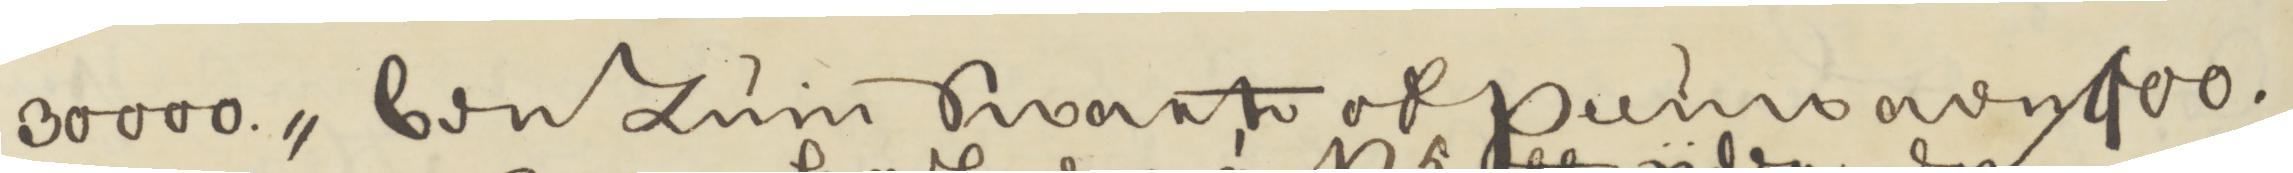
30000. „ benzuin swarte of peeuw aen 400.
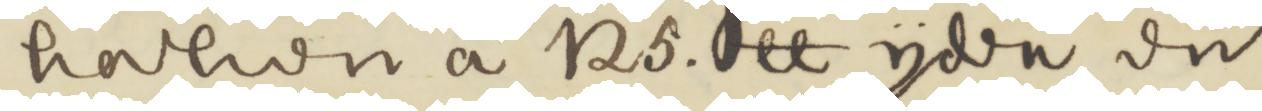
koeken á 125. lb ijder en
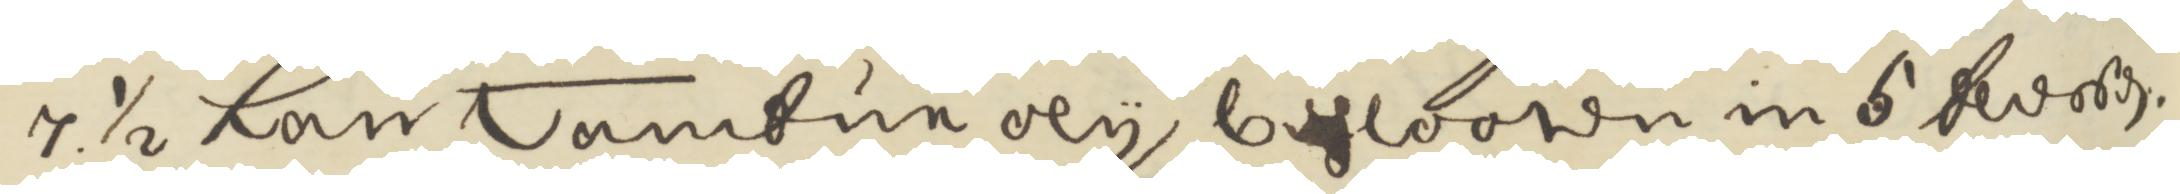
7. ½ kan Camfur olij beslooten in 5 flessen.
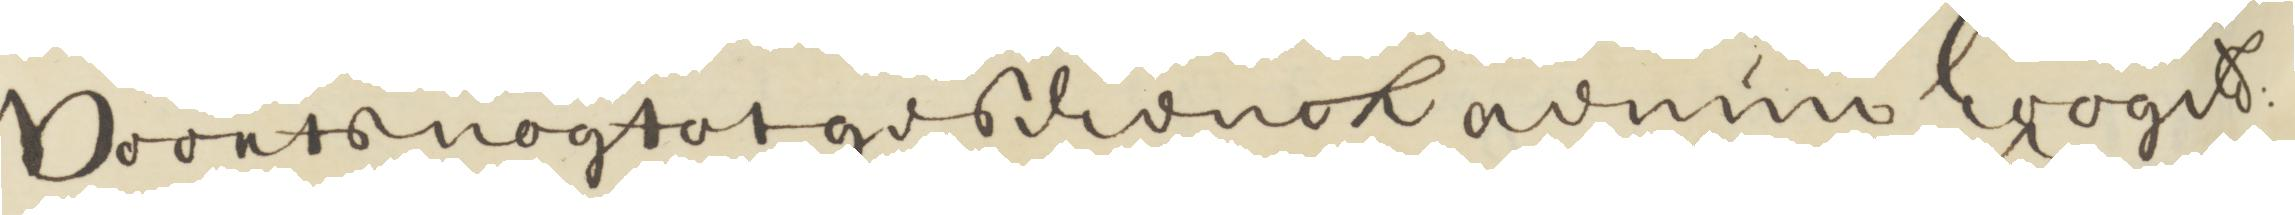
Voorts nog tot geschenck aen uw hoog Ed:
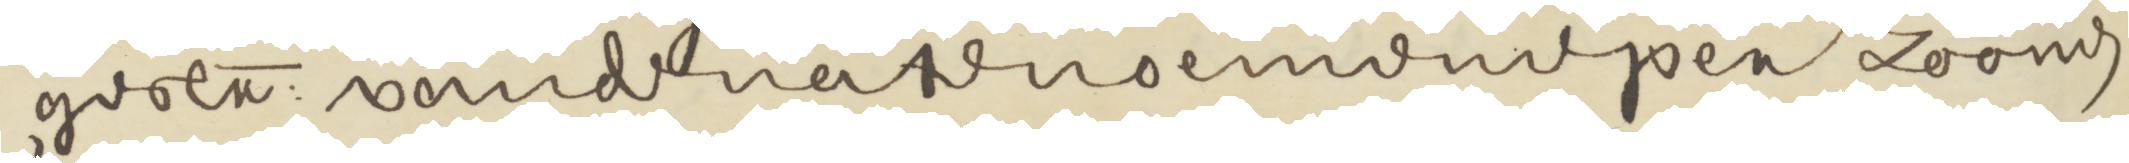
gestr: van de na te noemene perzoonen
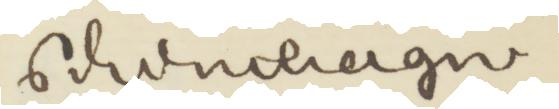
schenckagie
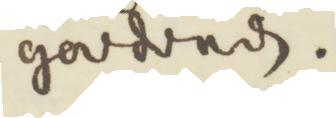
goederen.
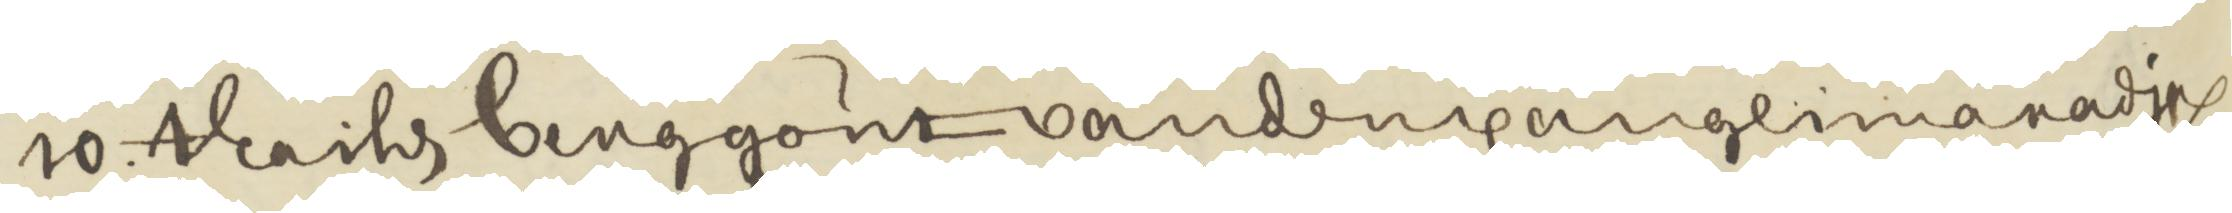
10. thailen berggout van den panglimaradir
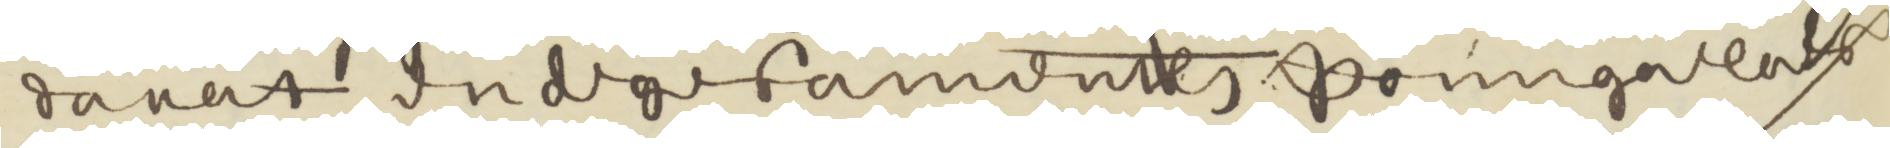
darat en de gesament Poungoeloes
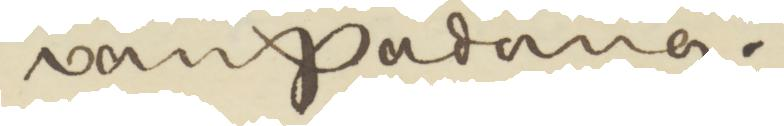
van Padang.
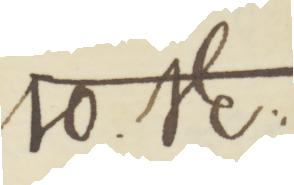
10. th:
